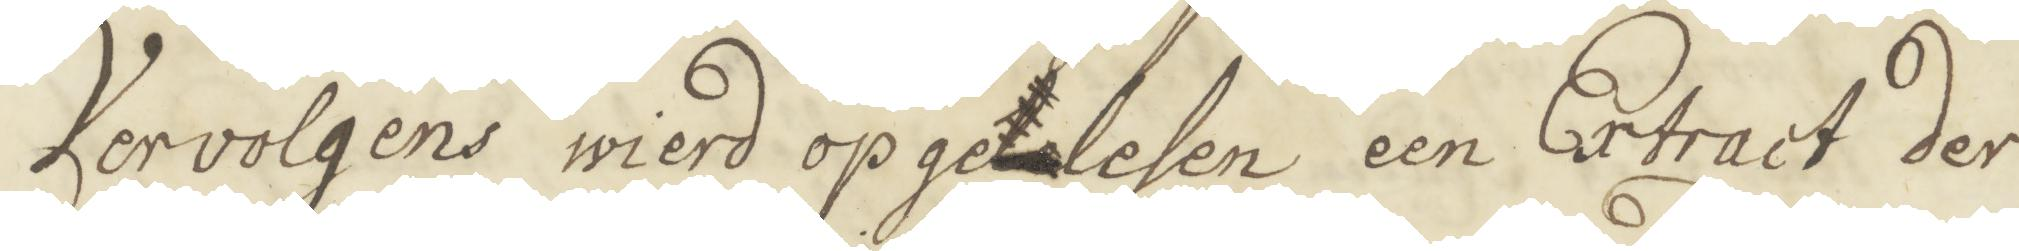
Vervolgens wierd op gelelesen een Extract der
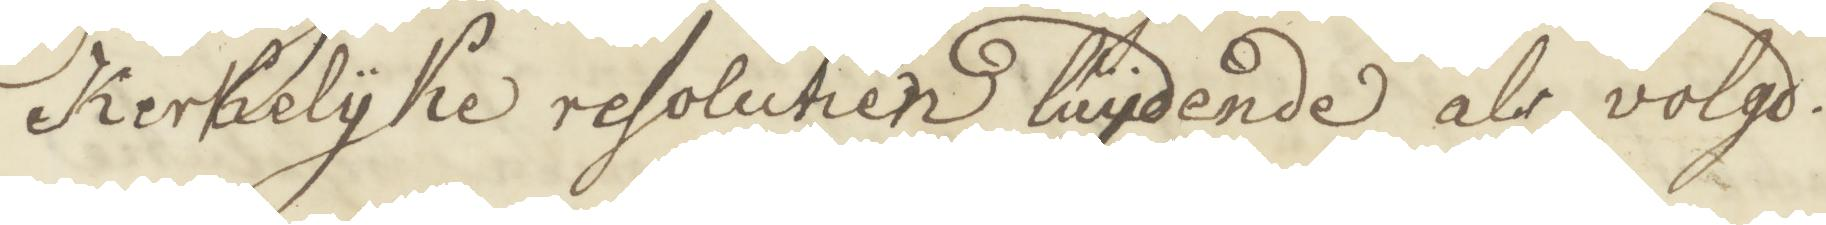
Kerkelijke resolutien luijdende als volgd
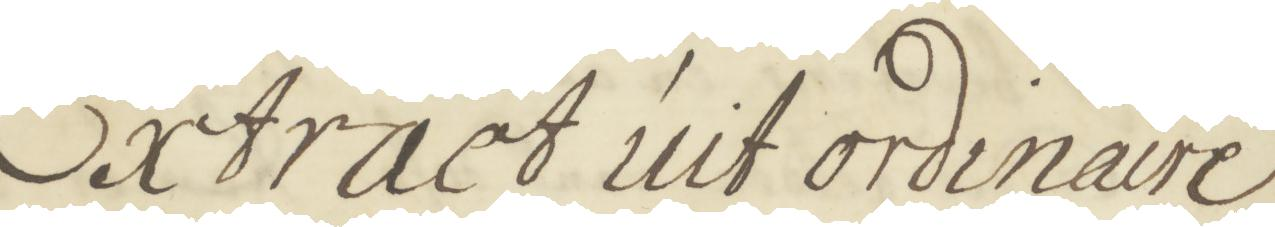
Extract uit ordinaire
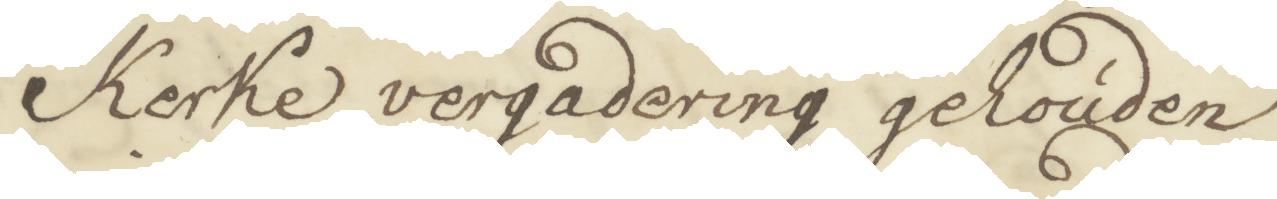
Kerke vergadering gehouden
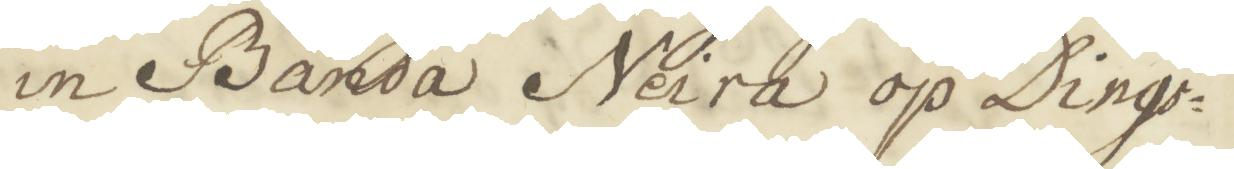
in Banda Neira op Dings=
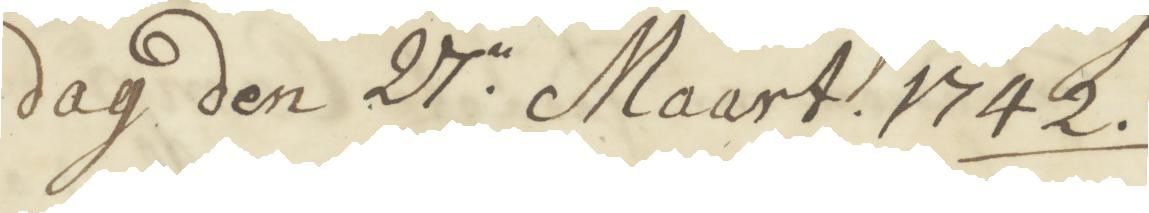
dag den 27.n Maart. 1742.
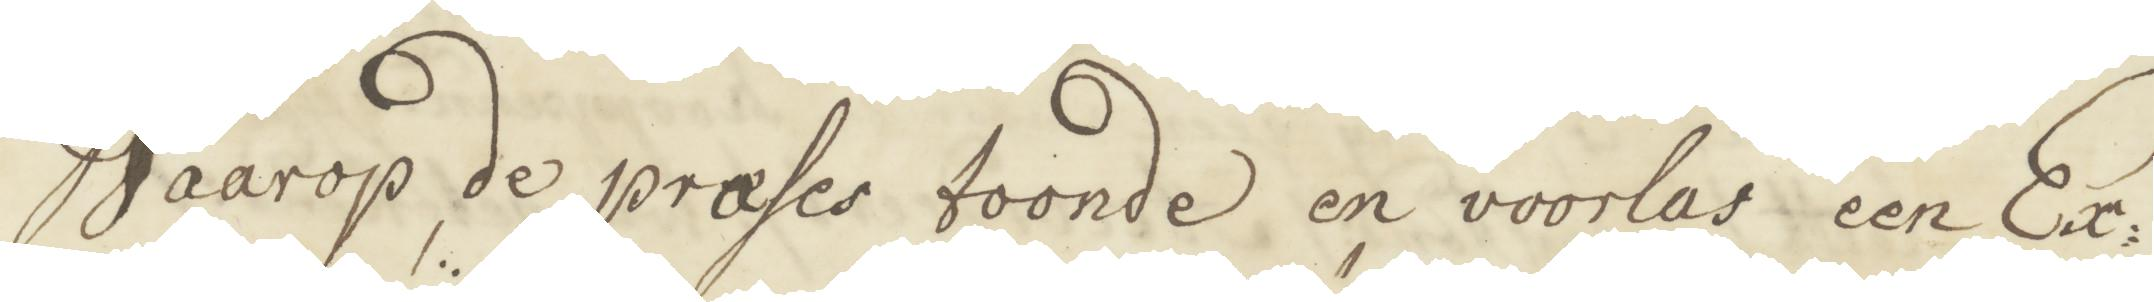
Waarop de praeses toonde en voorlas een Ex=
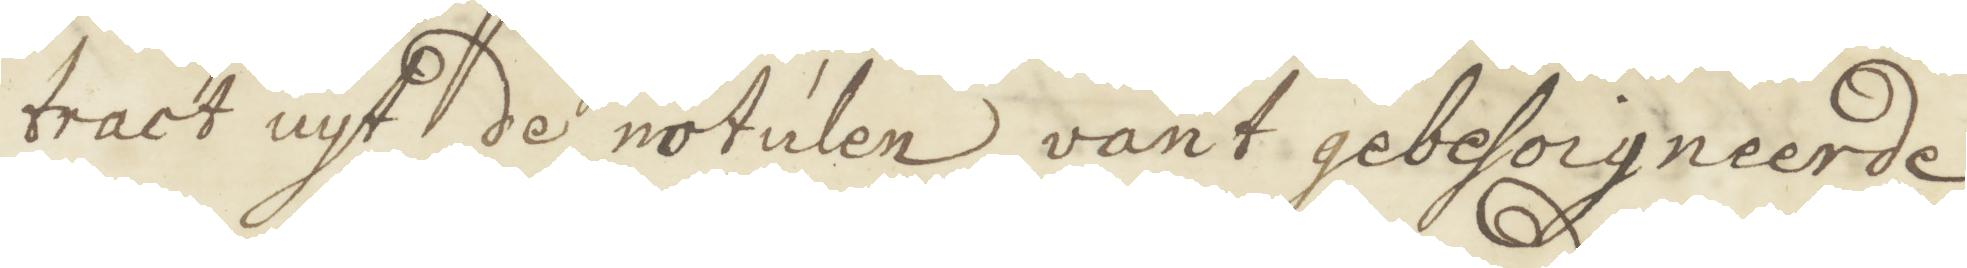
tract uijt de notulen van ’t gebesoigneerde
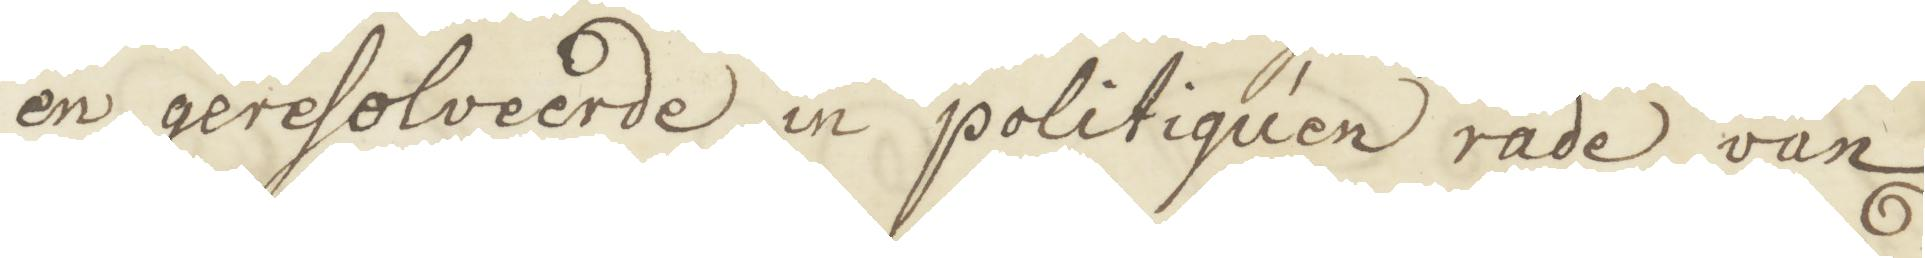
en geresolveerde in politiquen rade van
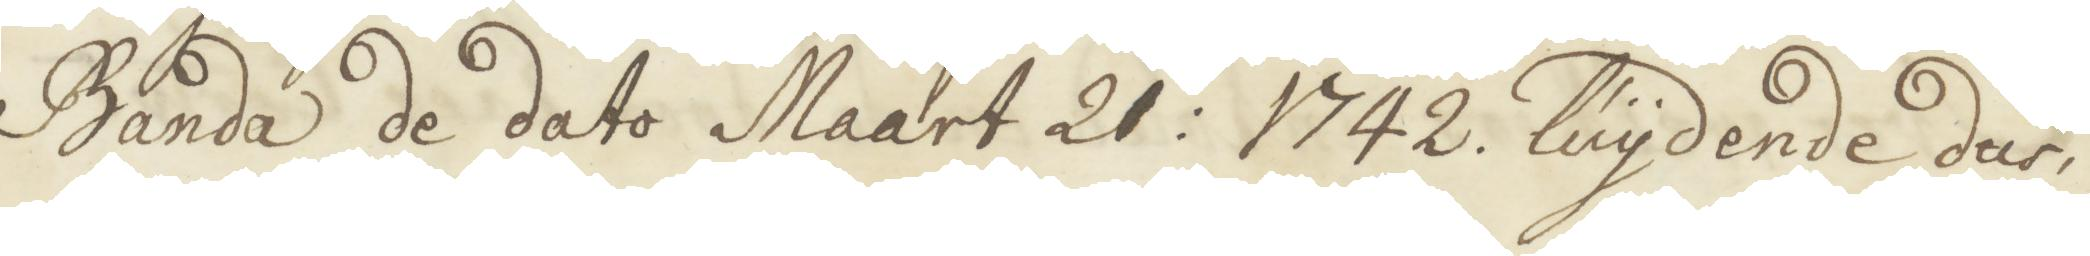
Banda de dato Maart 21 : 1742. luijdende dus,
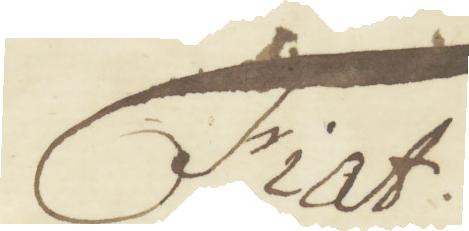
Fiat.
